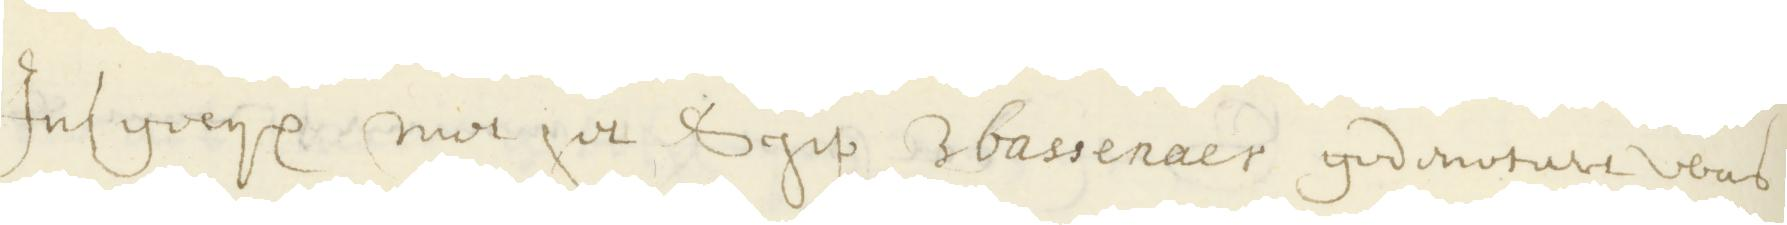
Insgelyx met het schip wassenaer gedenoteert was
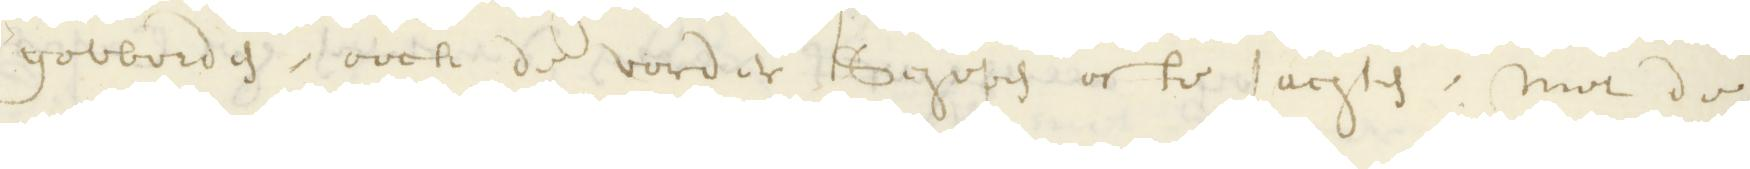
gewerden, oock de vorder schepen ofte jachten, met de
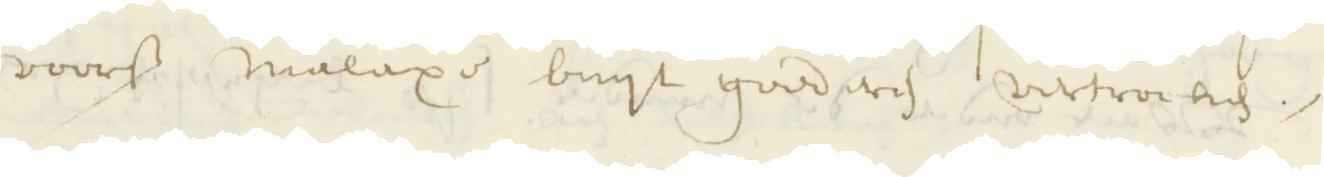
voors malaxe buyt goederen vertrocken./
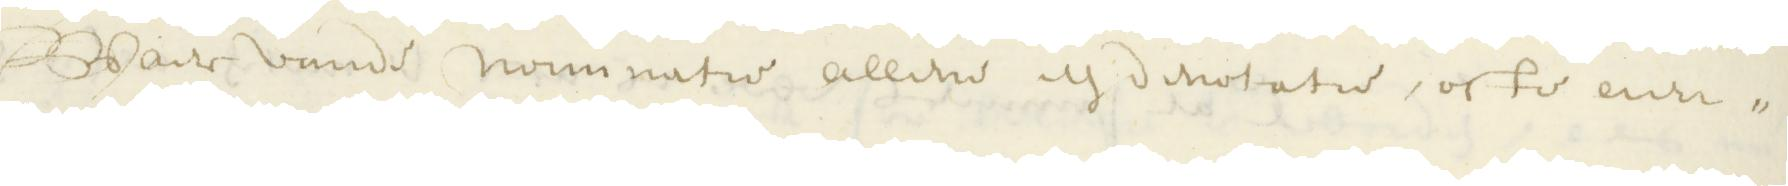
Waer vande nominatie allene een denotatie, ofte aen„
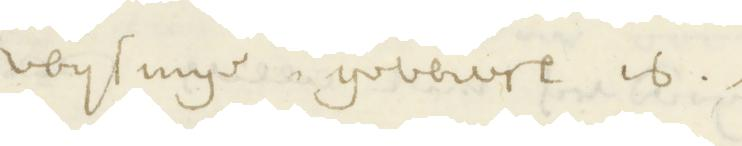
wysinge geweest is.
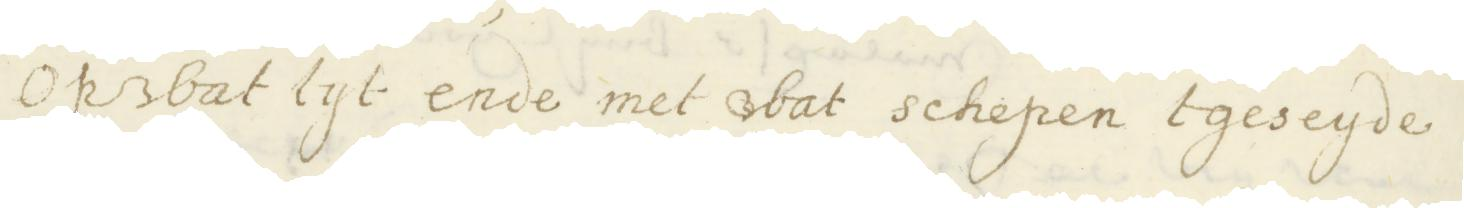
Opwat tyt ende met wat schepen tgeseyde
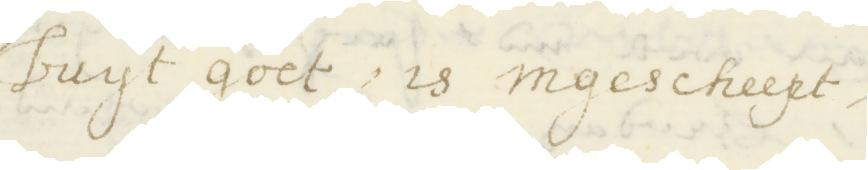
buyt goet, is ingescheept,
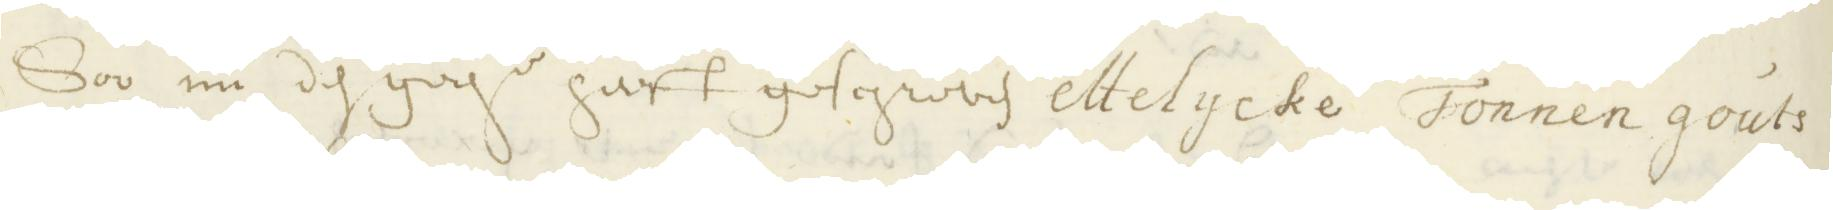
Soo nu den geene heeft gesgreven ettelycke Tonnen gouts
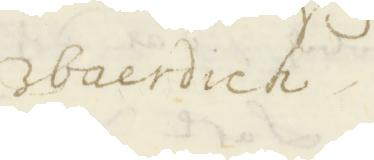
waerdich,
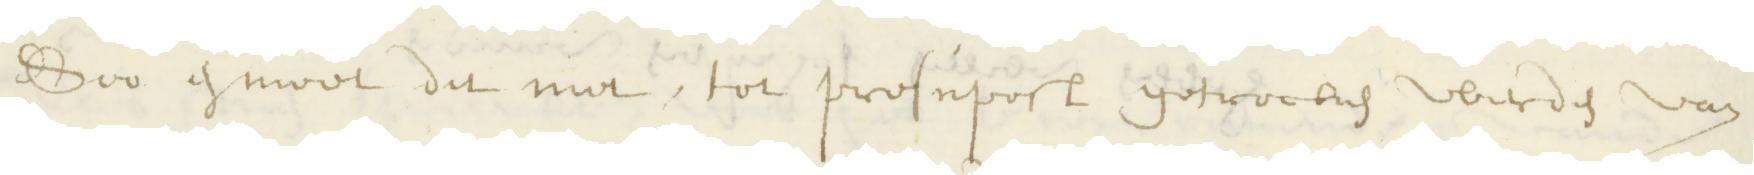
Soo en moet dit niet, tot presupost getrocken werden van
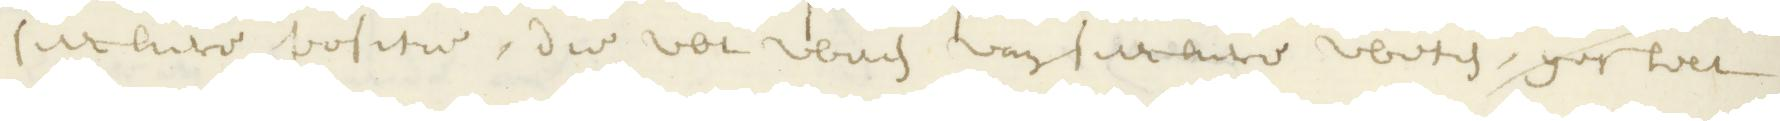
seeckere positie, die wt waen van seeckere weten, gestelt
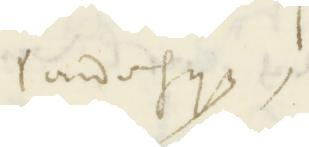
soudesyn,
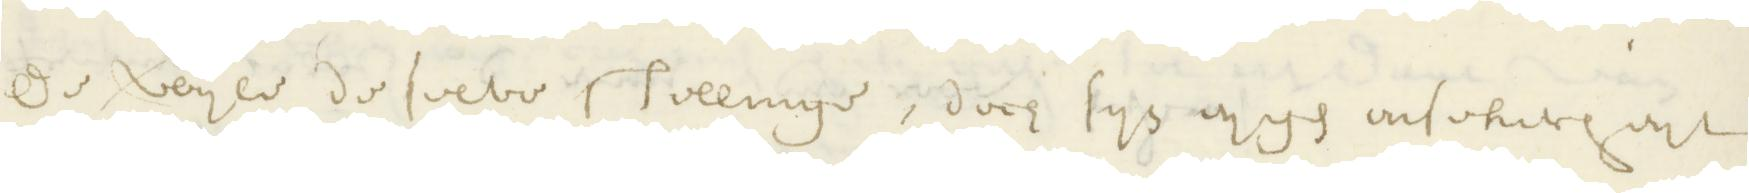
De wyle de selve stellinge, doch syn enigen onsekerheyt
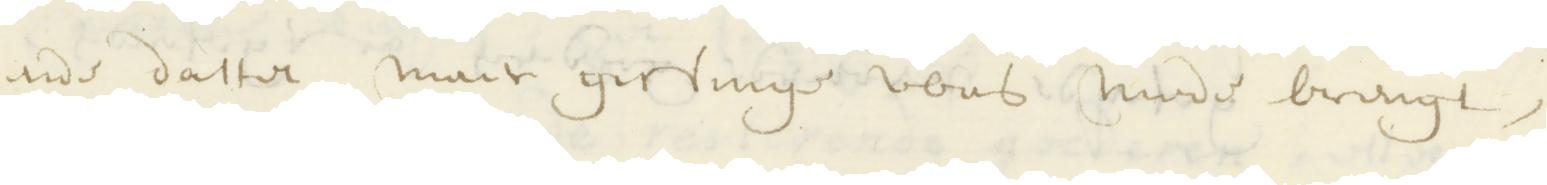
ende datter maer gissinge was mede brengt
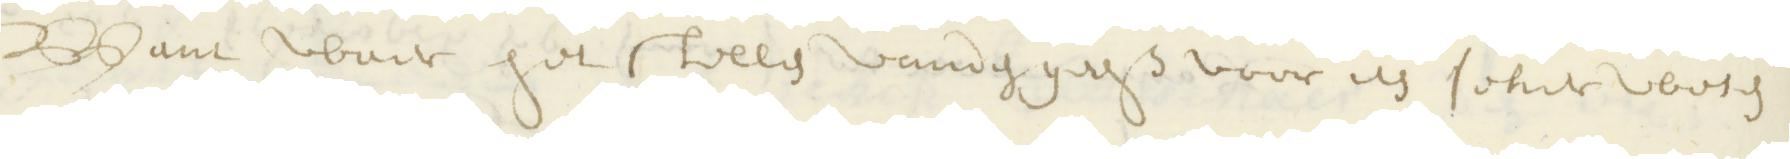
Want waer het stellen vanden geenen voor een seker weten
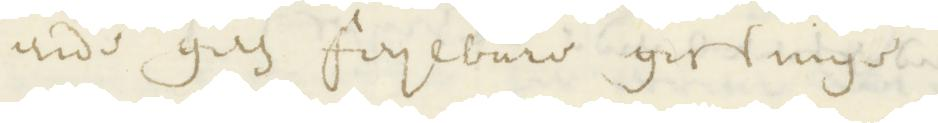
ende geen feylbare gissinge
